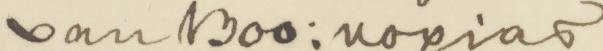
van 1300: ropias
